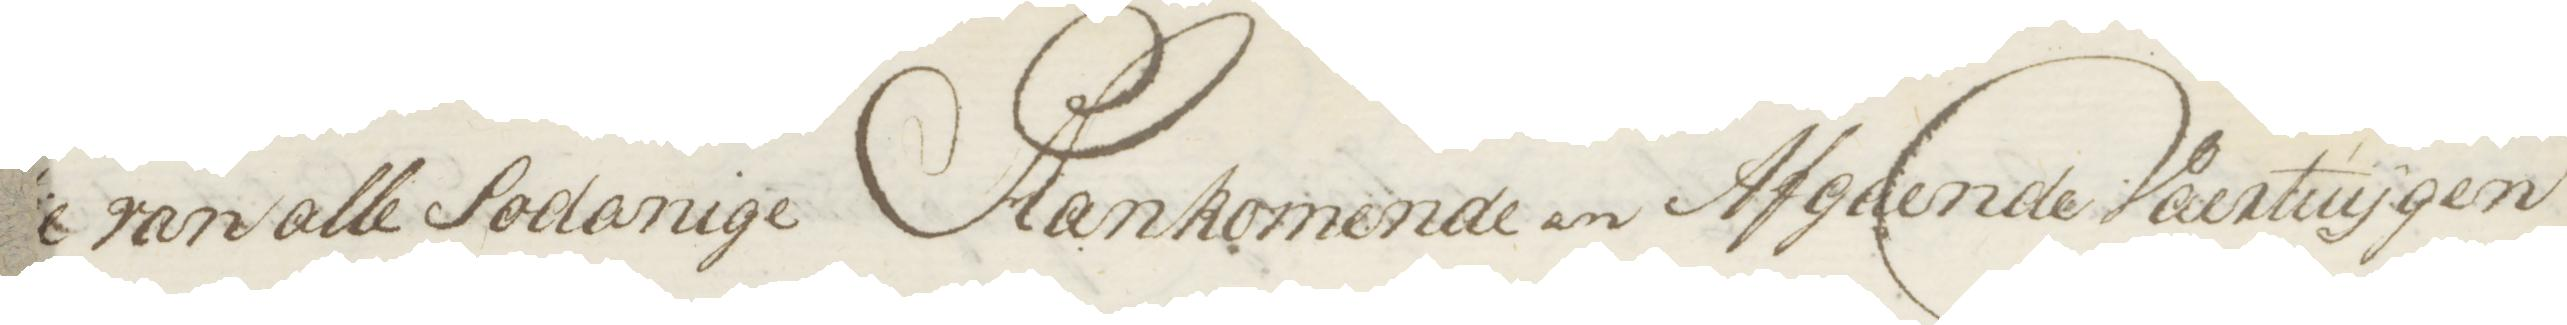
e van alle sodanige Aankomende en Afgaende Vaertuijgen
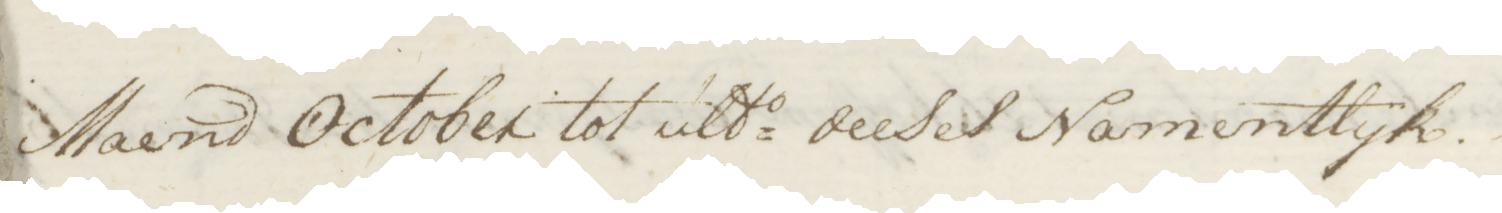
Maend October tot ult=o deeses Namentlijk.
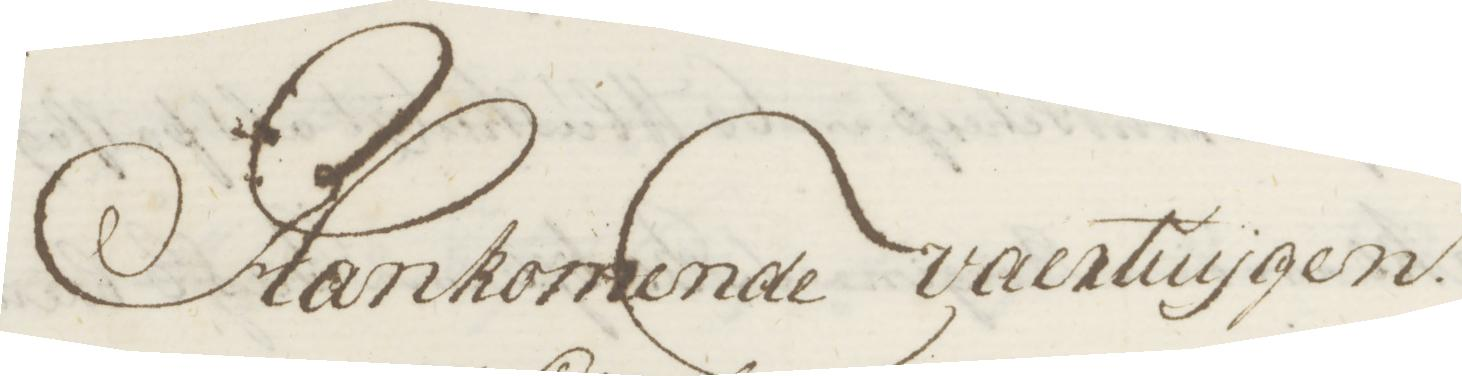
Aankomende vaertuigen.
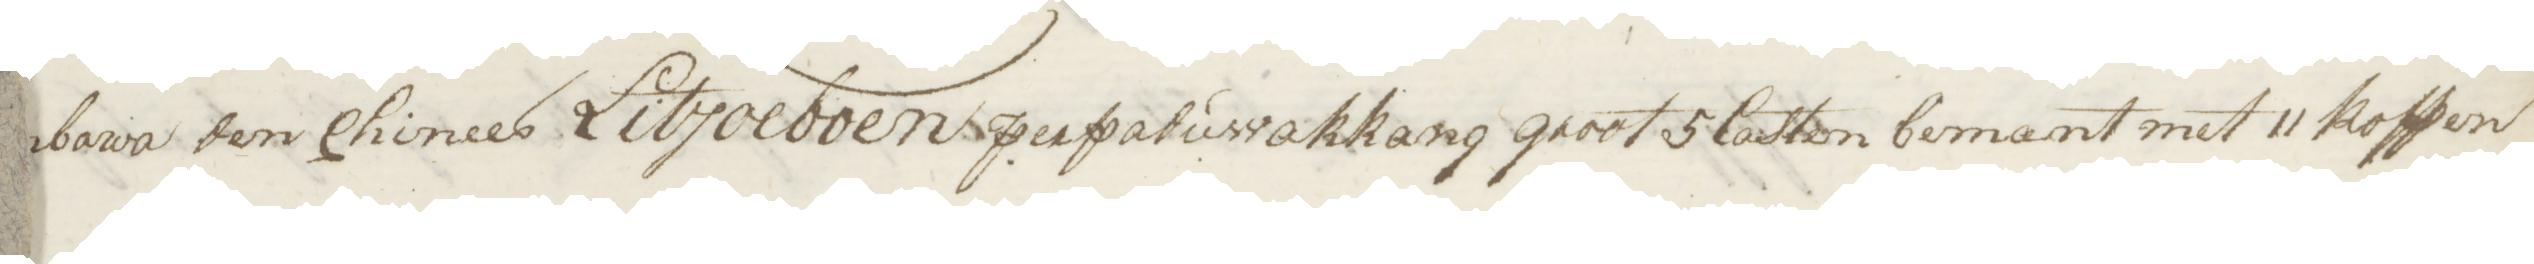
bawa den Chinees Litjoeboen per paduwakkang groot 5 lasten bemant met 11 koppen
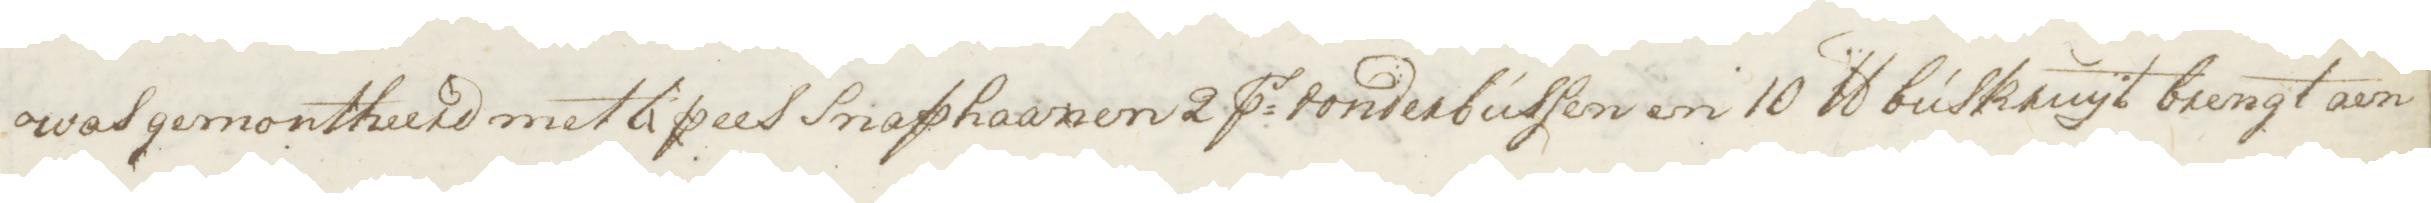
was gemontheerd met 4 pees snaphaanen 2 p=s donderbussen en 10 lb buskruijt brengt aen
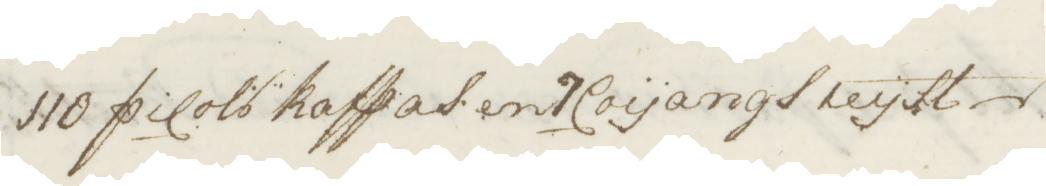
110 picols kappas en 7 Coijangs reijst —
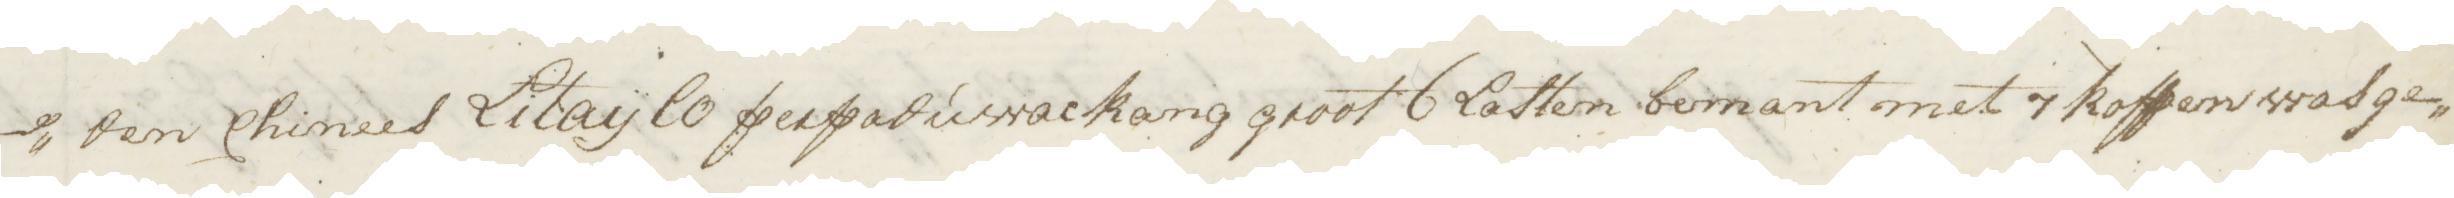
_„o den Chinees Litaijlo per paduwackang groot 6 lasten bemant met 7 koppen was ge„
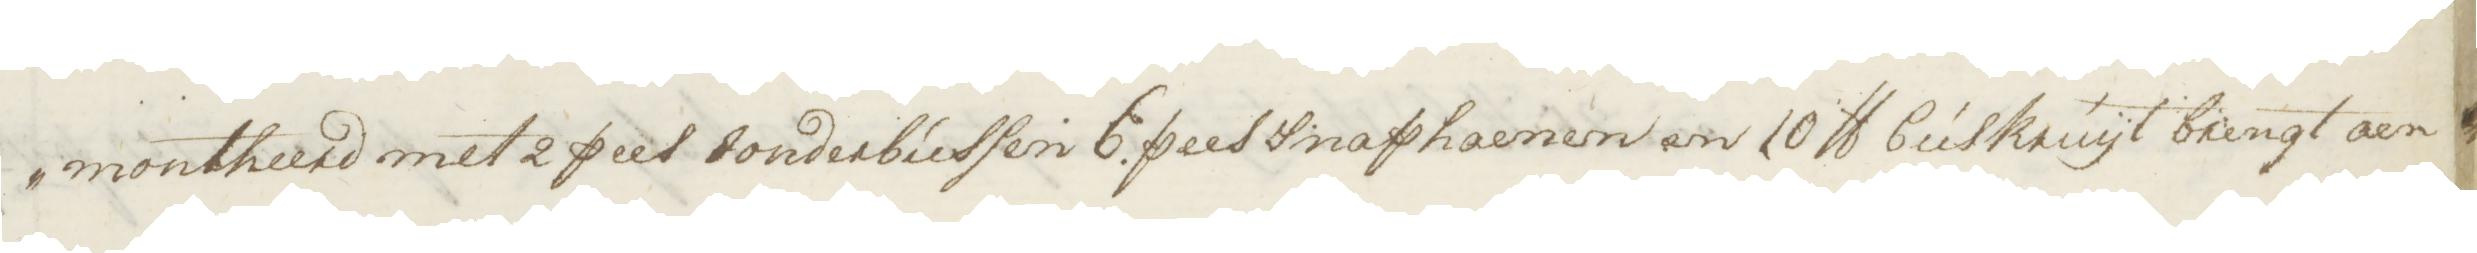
„montheerd met 2 pees donderbussen 6. pees snaphaenen en 10 lb buskruijt brengt aen
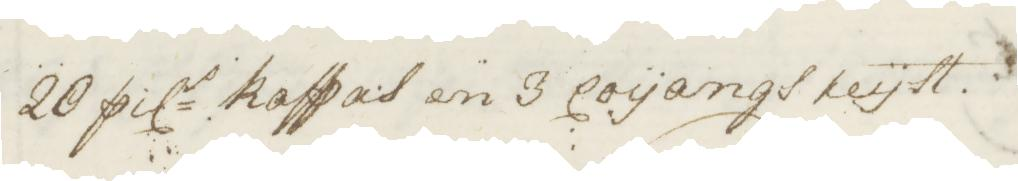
20 pic=s kappas en 3 Coijangs reijst.
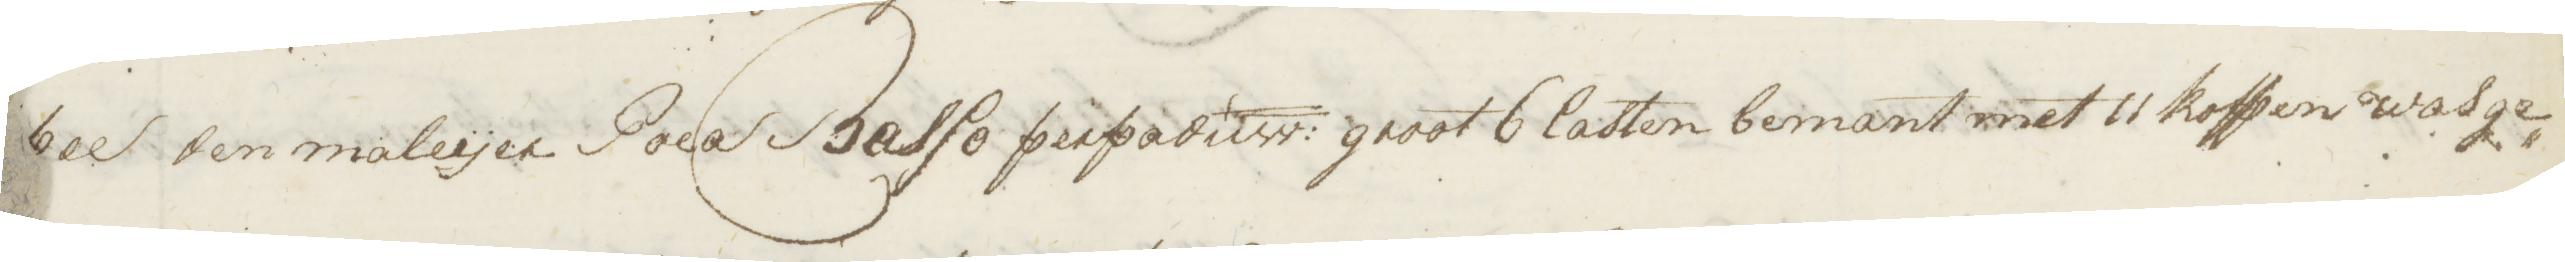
oe den maleijer Poea Basso per paduw: groot 6 lasten bemant met 11 koppen was ge„
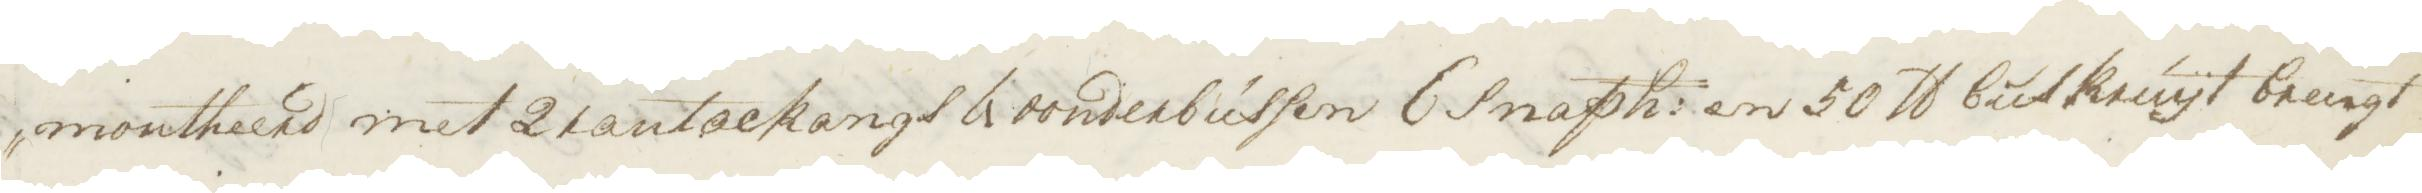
„montheerd met 2 rantoekangs 4 donderbussen 6 snaph: en 50 lb buskruijt brengt
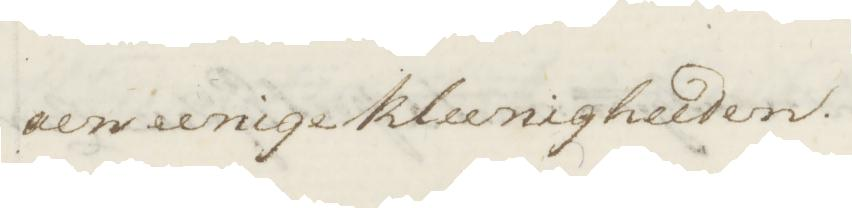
aen eenige kleenigheeden.
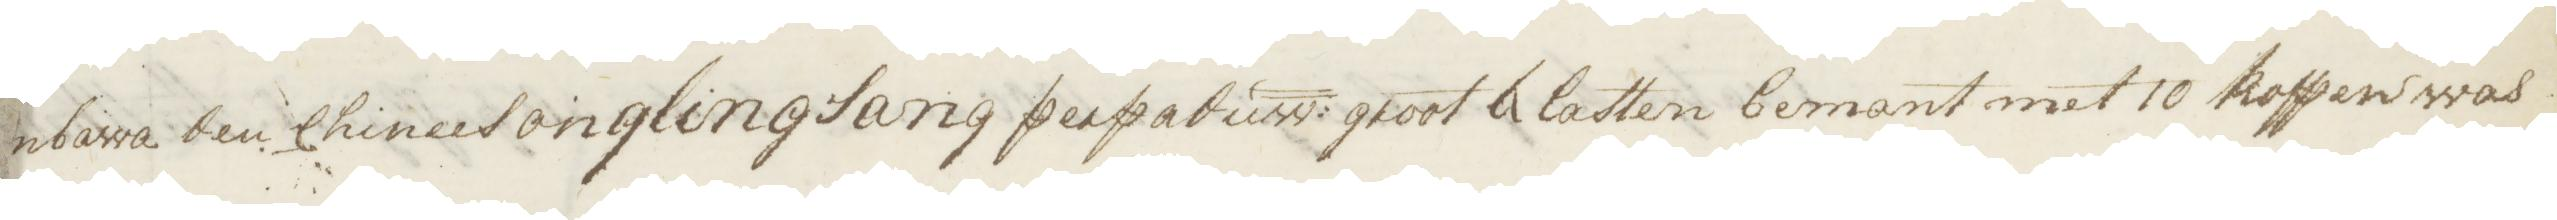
nbawa den Chinees ongling sang per paduw: groot 4 lasten bemant met 10 koppen was
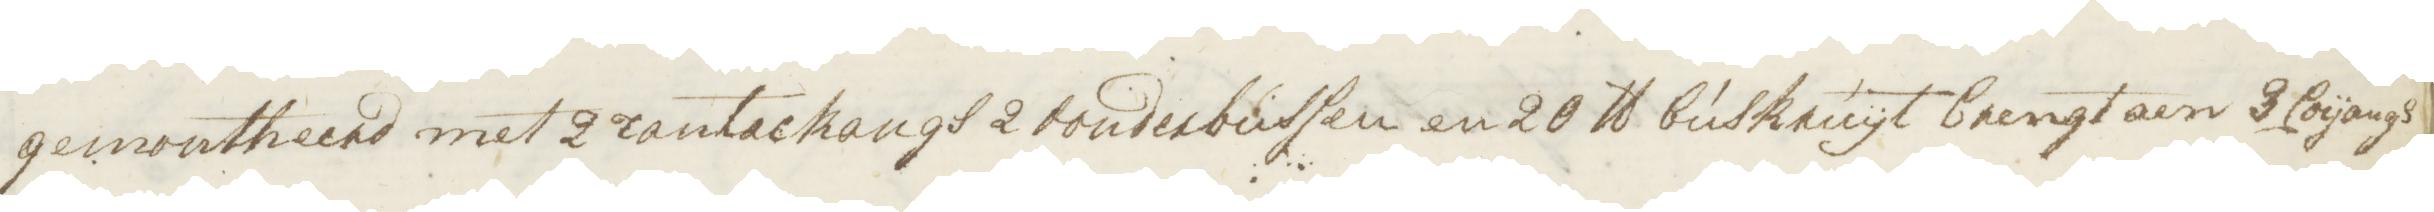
gemontheerd met 2 rantoekangs 2 donderbussen en 20 lb buskruijt brengt aen 3 Coijangs
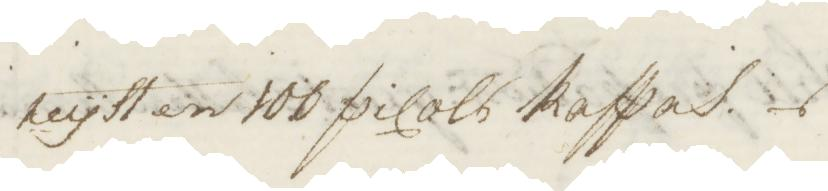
reijst en 100 picols kappas. —
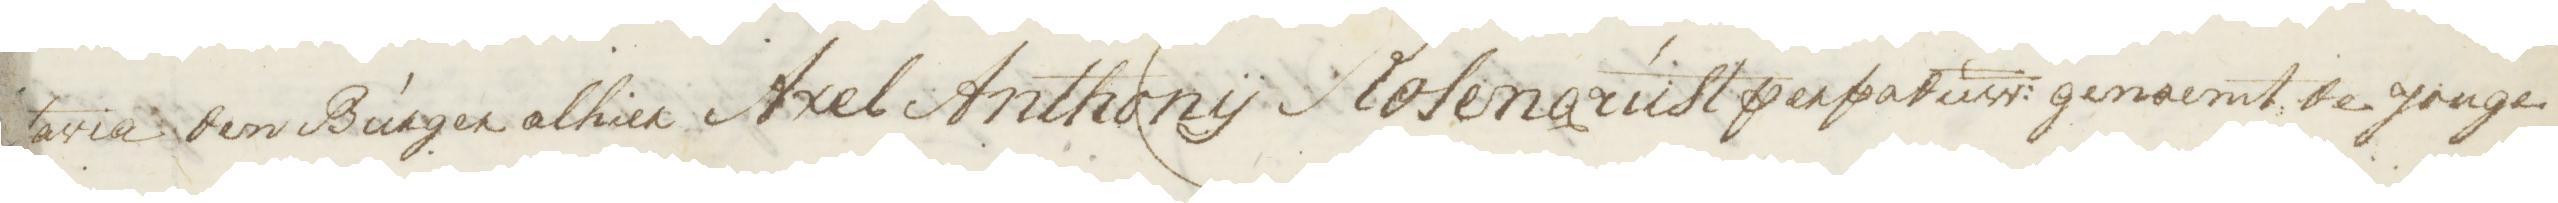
tavia den Burger alhier Axel Anthonij Rosena rust per paduw: genaemt de jonge
